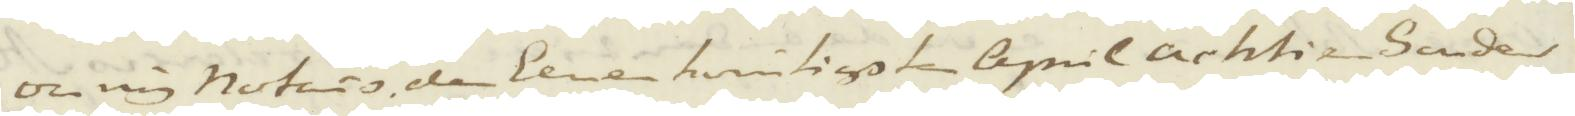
van mij Notaris, den Eenen twintigsten April achtien hondert
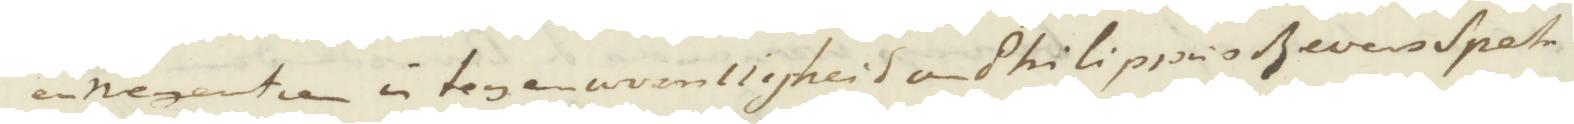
en negentien in tegenwoordigheid van Philippus Reven Spek
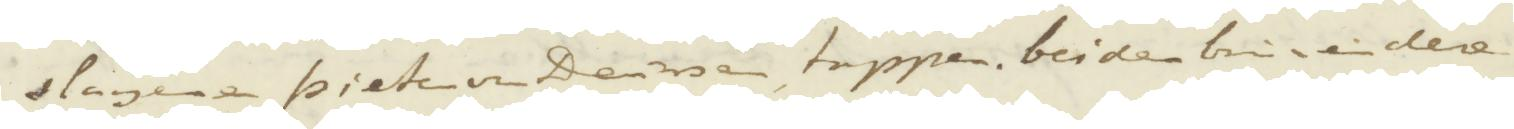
slager en pieter van Deursen, tapper, beide binnen deze
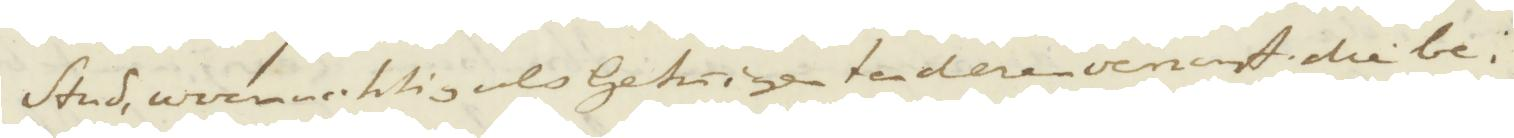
Stad, woonachtig als Getuigen ten dezen verzogt die be.
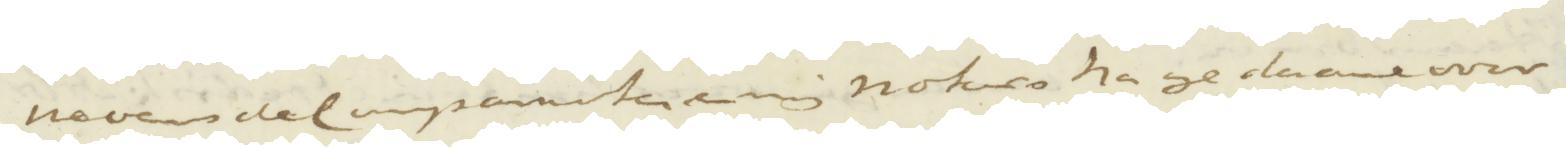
nevens de Comparanten en mij notaris Na gedaane voor
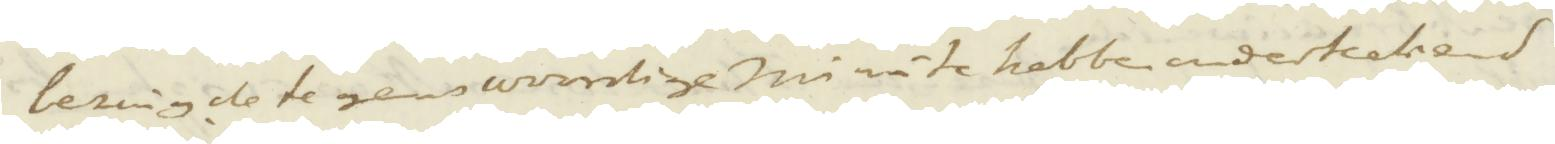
lezing de tegenswoordige minute hebben onderteekend
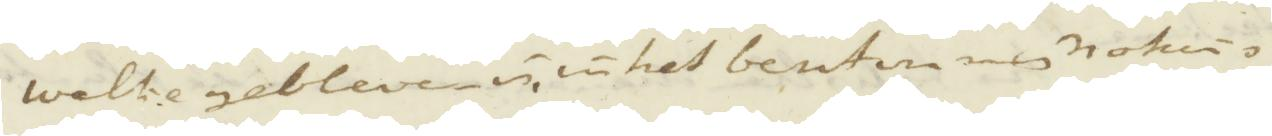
welke gebleven is, in het bezit van mij Notaris
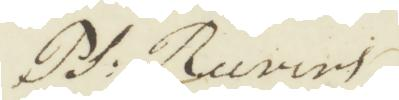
PS: Ruvers
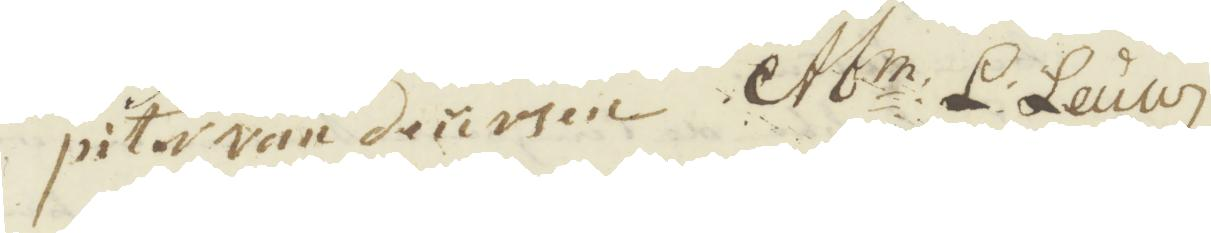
piter van deursen Ab=m: L: Leuw
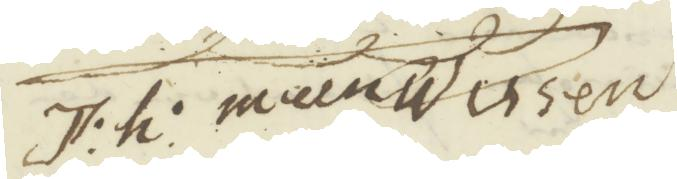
J: k: meeuwissen
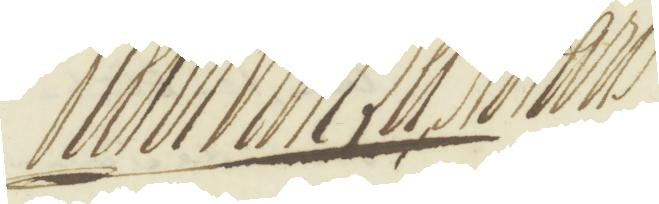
Pieter van Lee, notaris
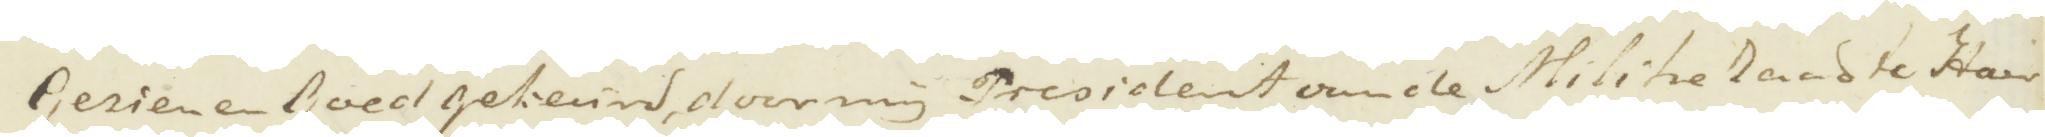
Gezien en Goed gekeurd, door mij President van de Militie Raad te Haer
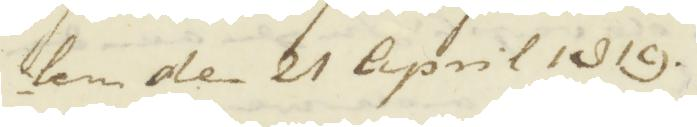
,lem den 21 April 1819.
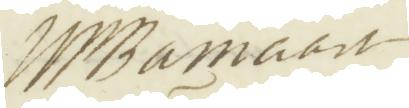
W Bamaart
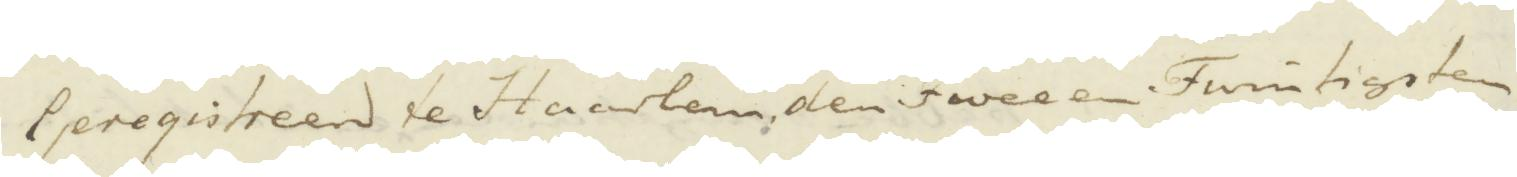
Geregistreerd te Haarlem, den Twee en Twintigsten
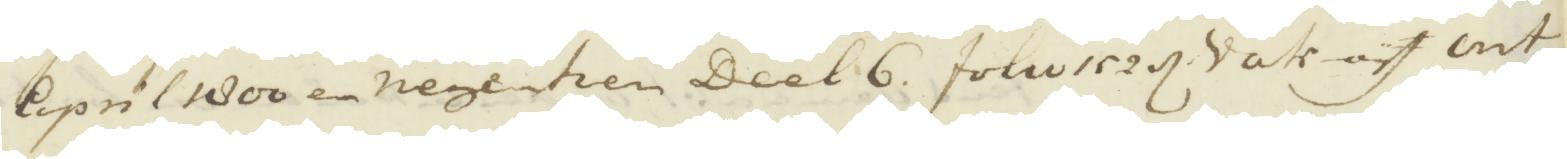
April 1800 en negentien Deel 6. folio 152 v vak vijff ont,
